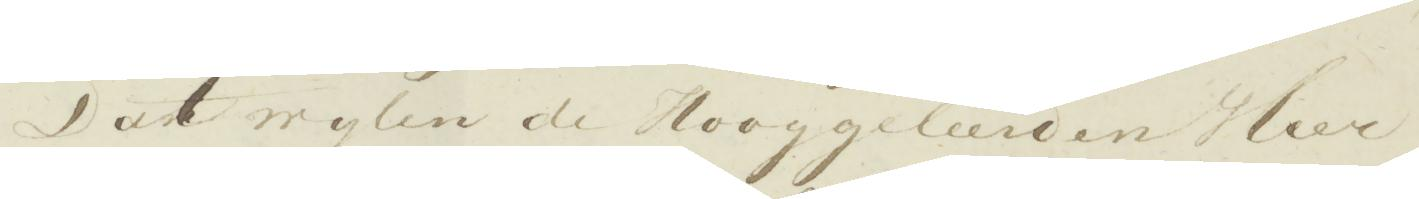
Dat wylen de Hooggeleerden Heer
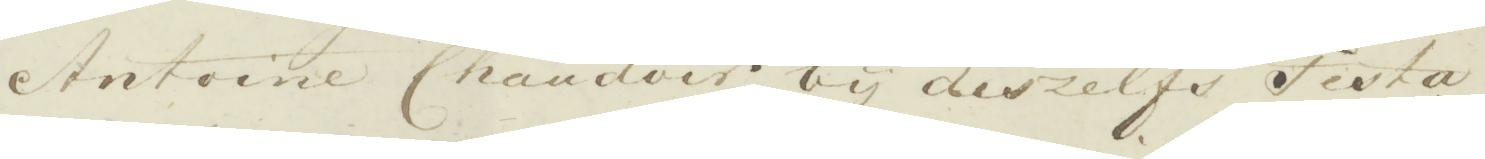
Antoine Chaudoir, bij deszelfs Testa
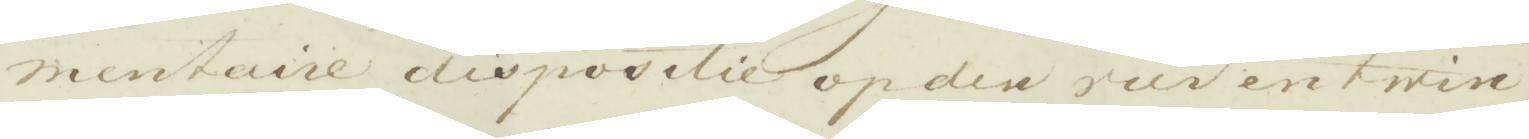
mentaire dispositie op den vier en twin
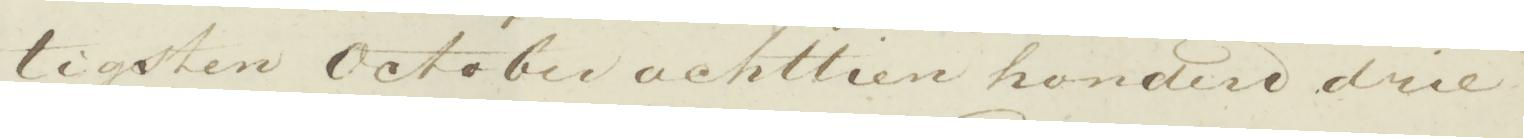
tigsten October achttien honderd drie
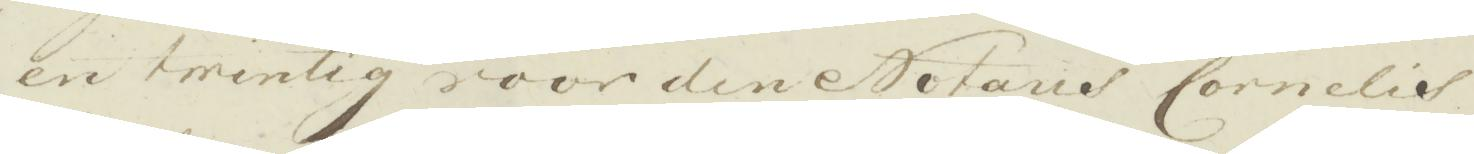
en twintig voor den Notaris Cornelis
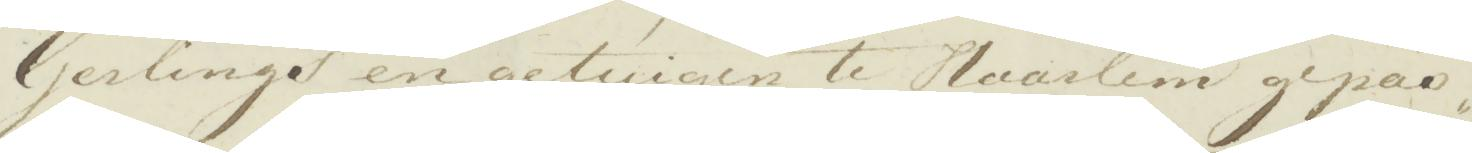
Gerlings en getuigen te Haarlem gepas„
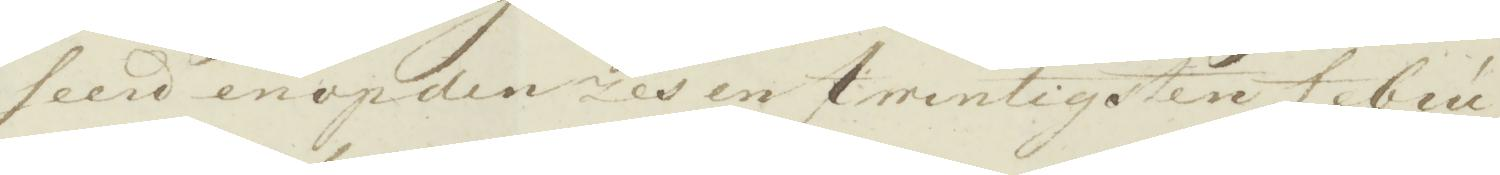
seerd en op den zes en twintigsten febru
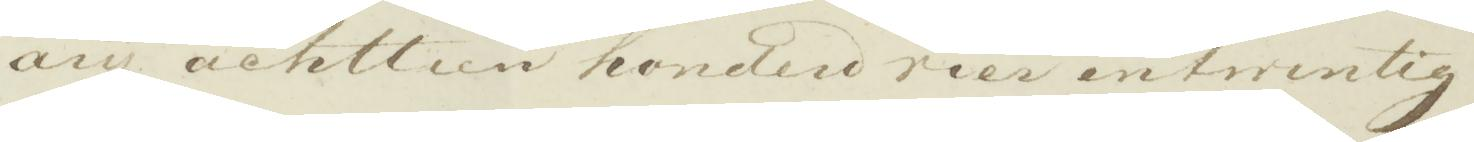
arij achttien honderd vier en twintig
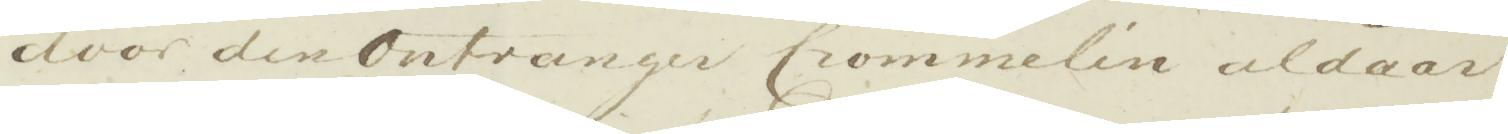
door den ontvanger Crommelin aldaar
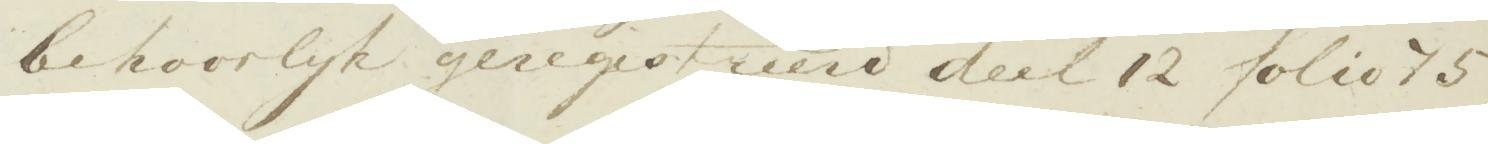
behoorlyk geregistreerd deel 12 folio 75
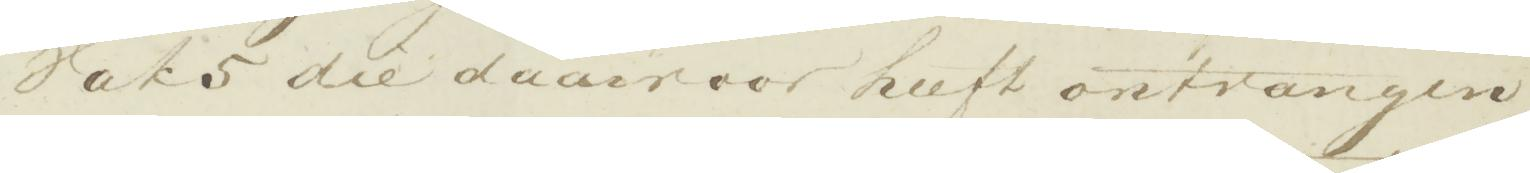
Vak 5 die daarvoor heeft ontvangen
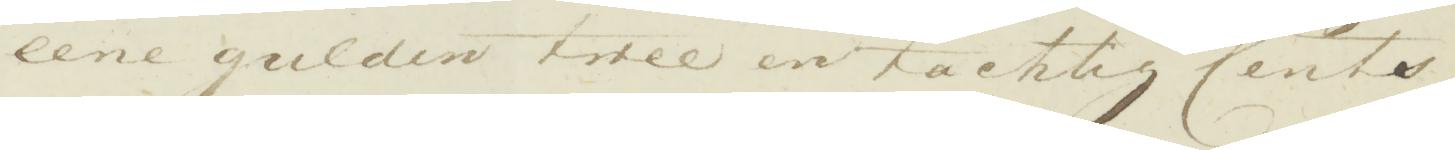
eene gulden twee en tachtig Cents
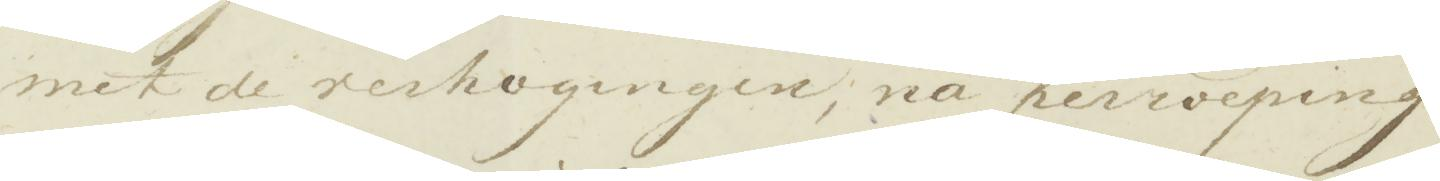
met de verhogingen, na herroeping
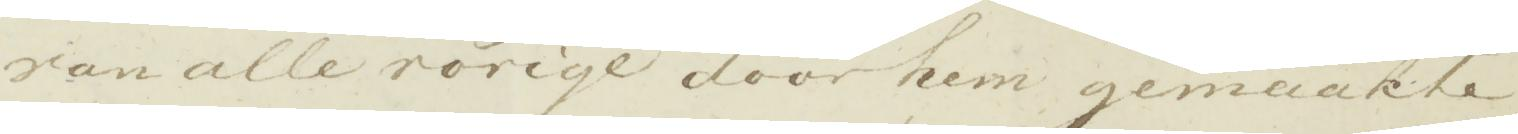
van alle vorige door hem gemaakte
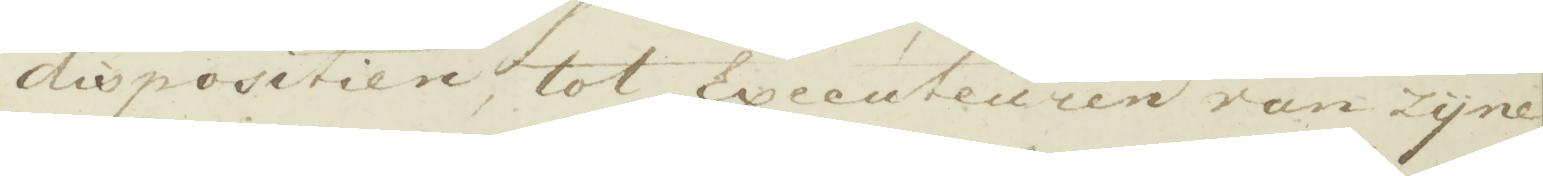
dispositien, tot Executeuren van zijne
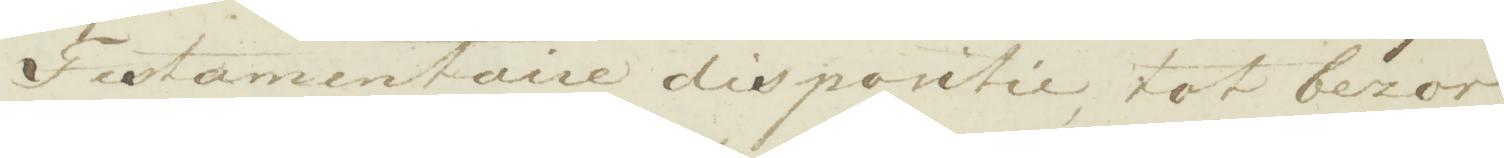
Testamentaire dispositie, tot bezor
